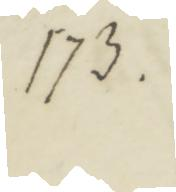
173.
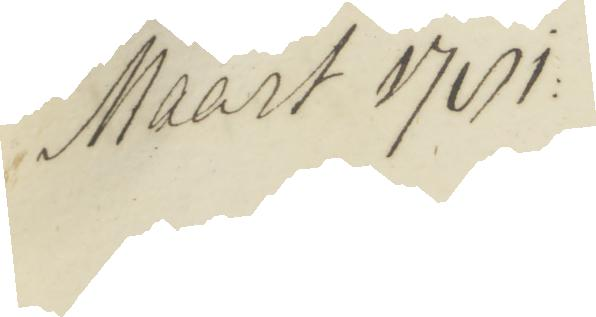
Maart 1781:
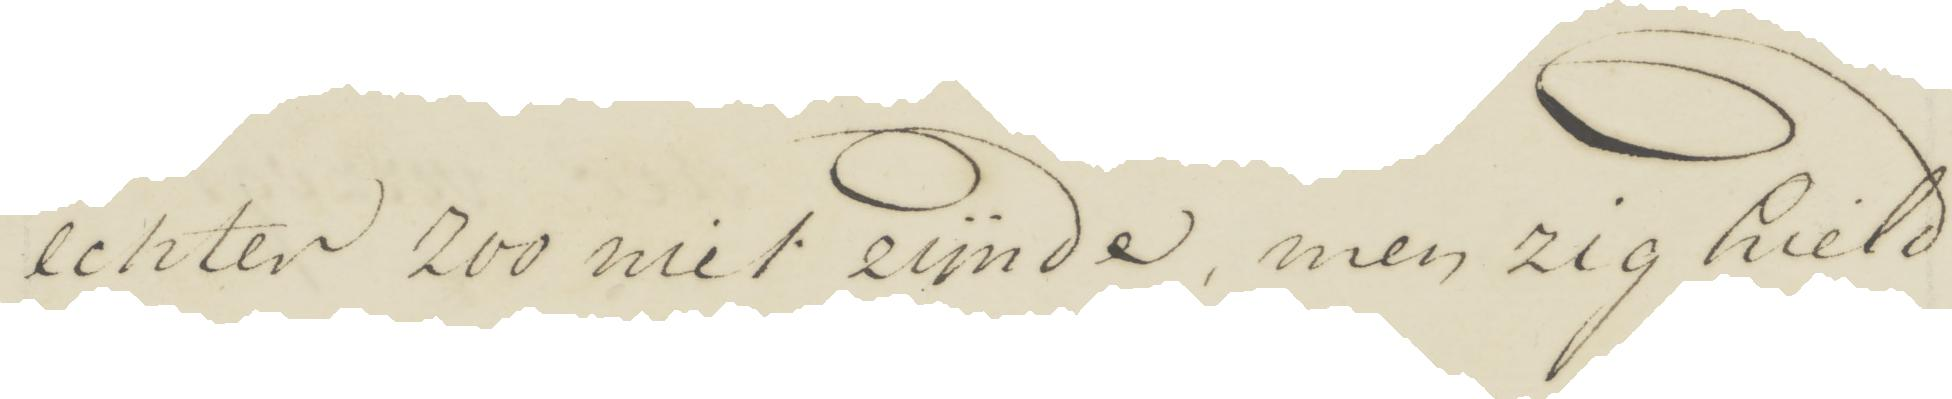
echter zoo niet zijnde, men zig hield
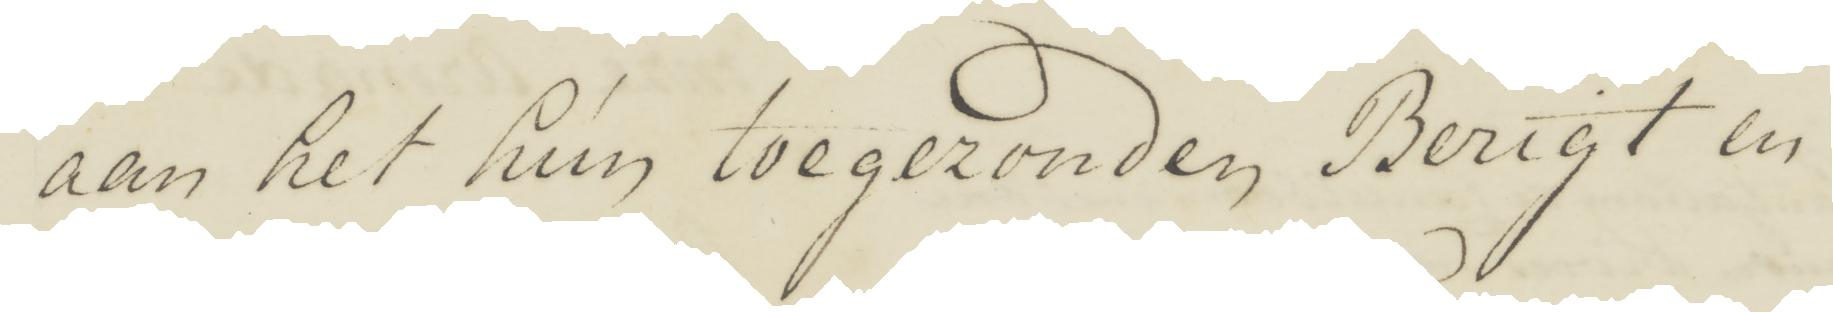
aan het hun toegezonden Berigt en
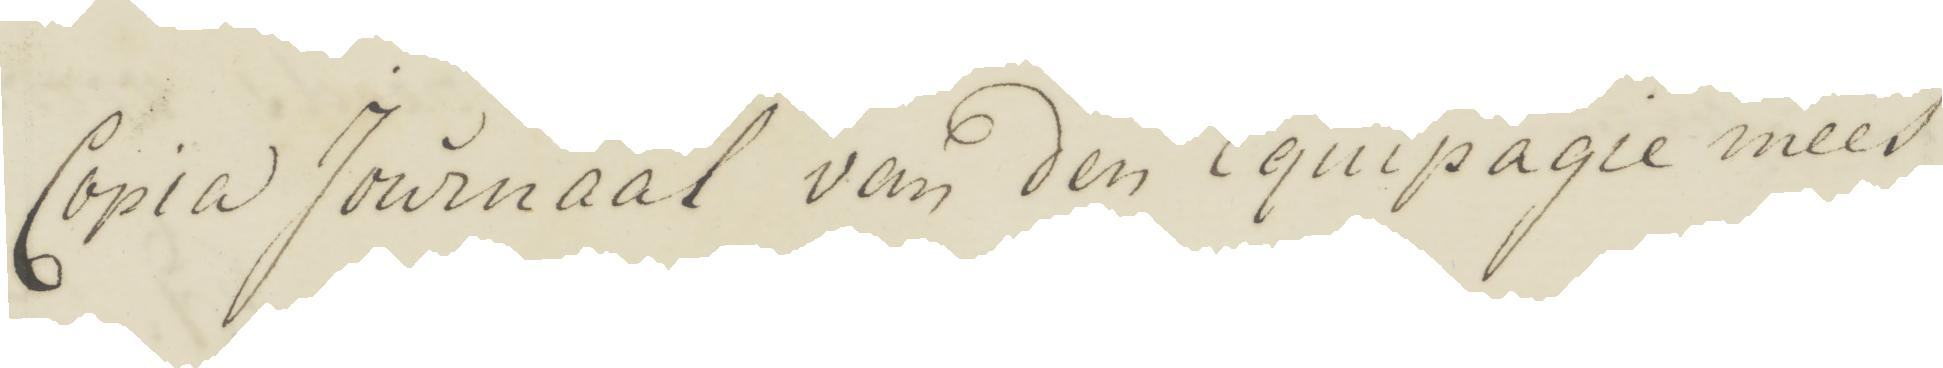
Copia Journaal van den Equipagie mees
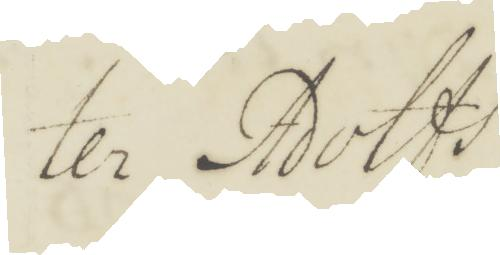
ter Adolfs
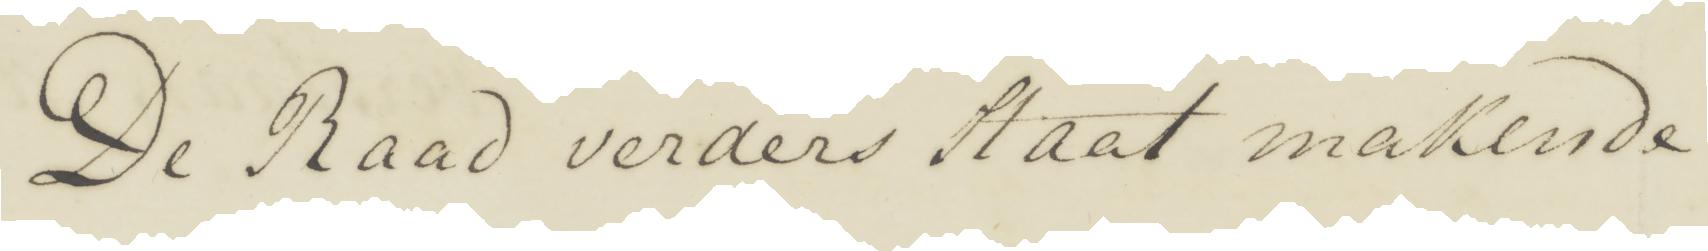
De Raad verders staat makende
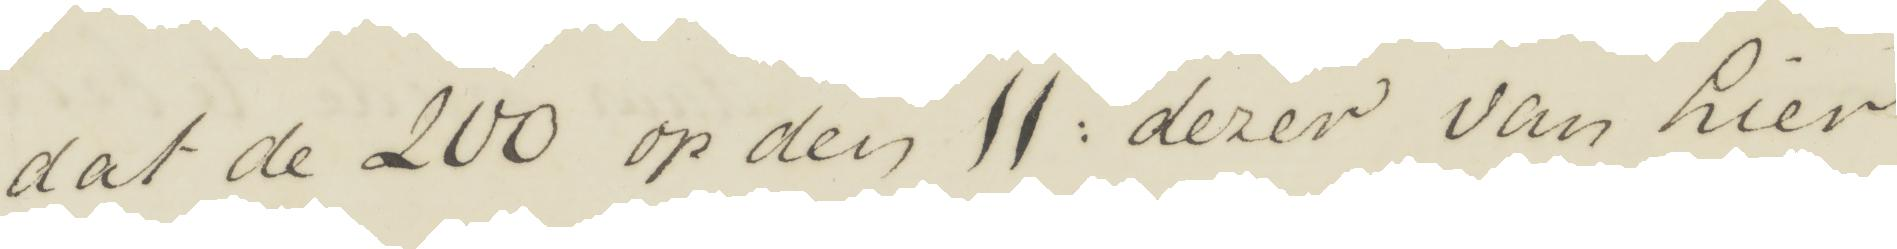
dat de 200 op den 11:' dezer van hier
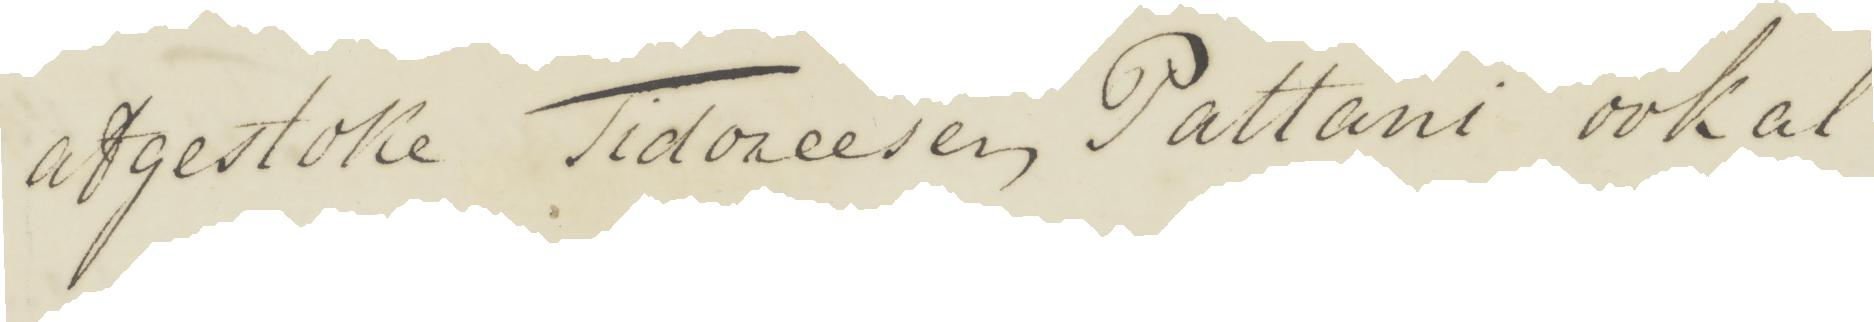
afgestoke Tidoreesen Pattani ook al
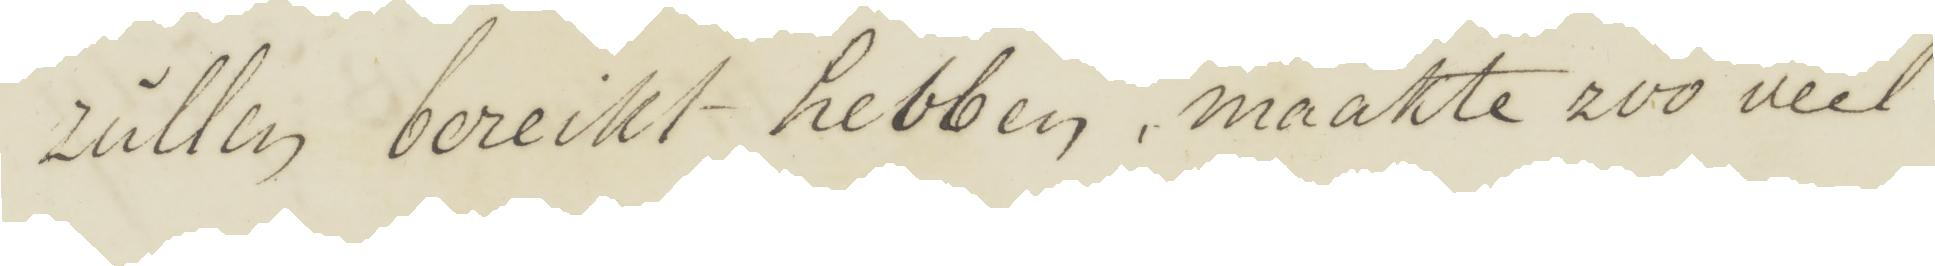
zullen bereikt hebben, maakte zoo veel
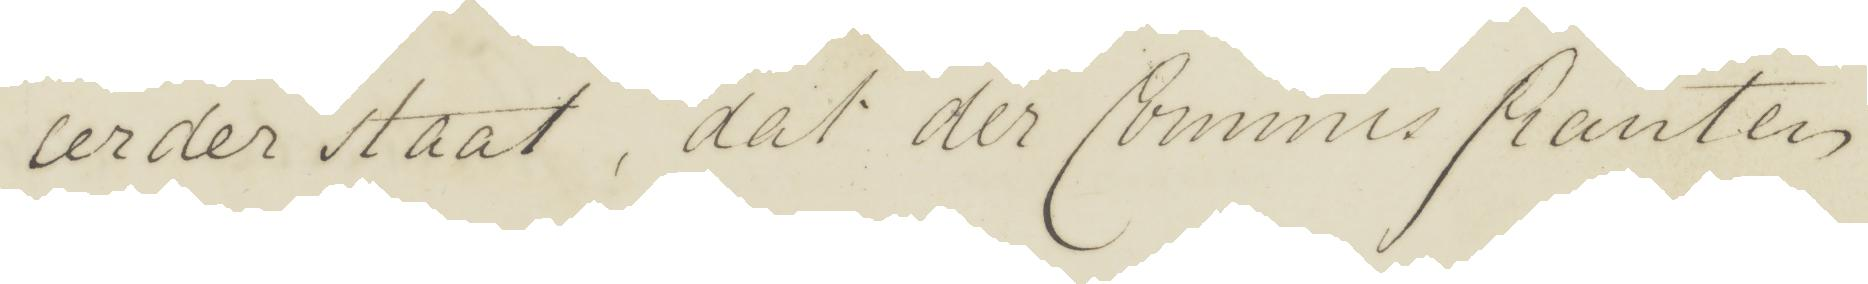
eerder staat, dat der Commissianten
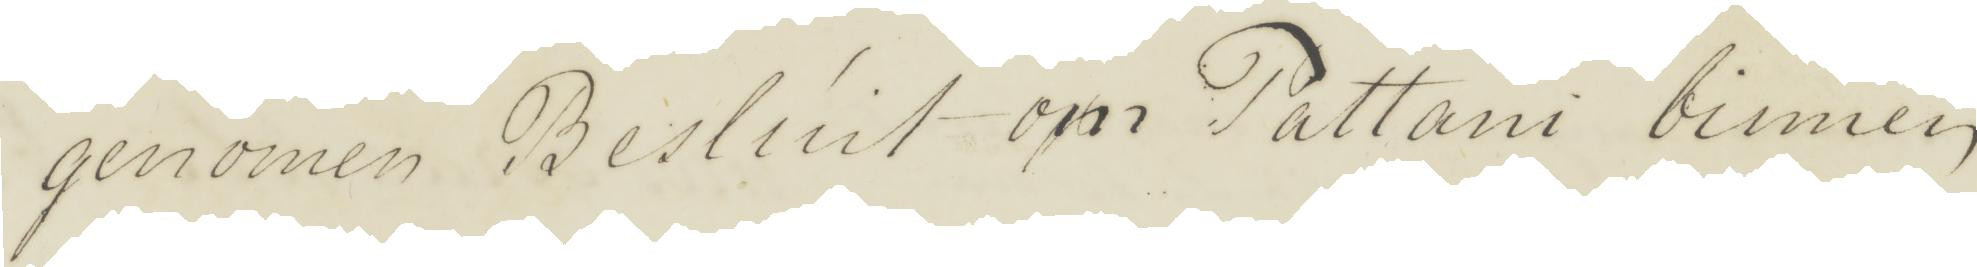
genomen Besluit om Pattani binnen
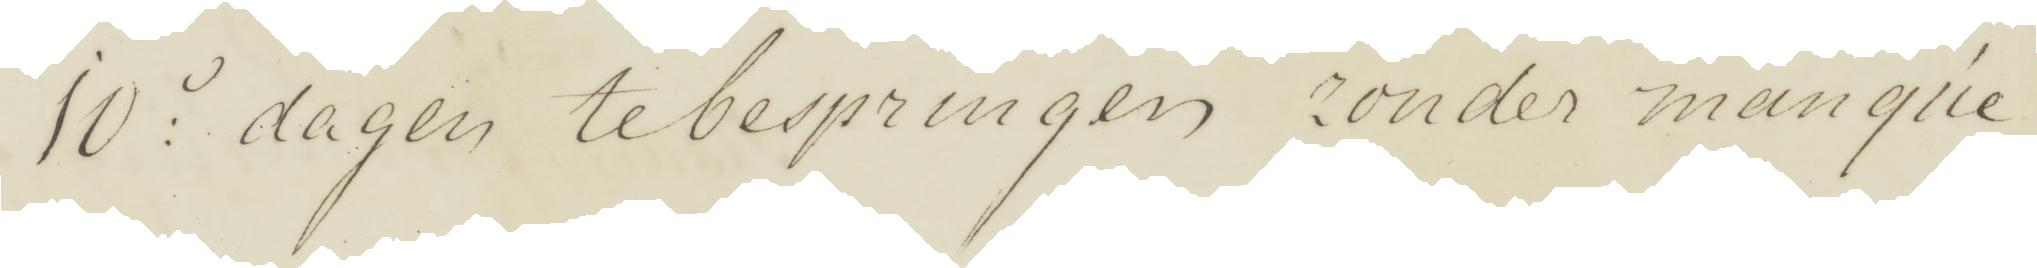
10:' dagen te bespringen zonder manque
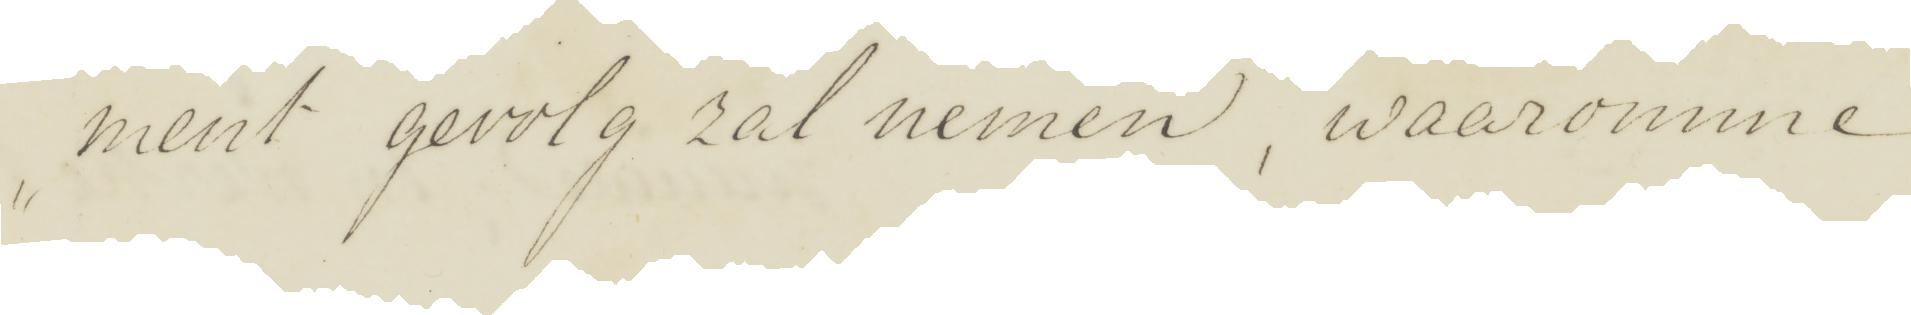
ment gevolg zal nemen, waaromme
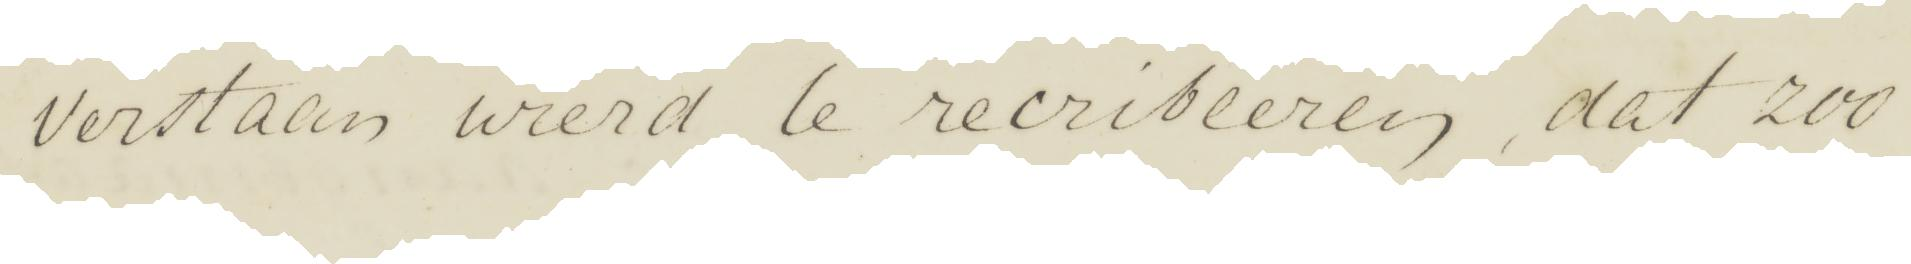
verstaan wierd te recribeeren, dat zoo
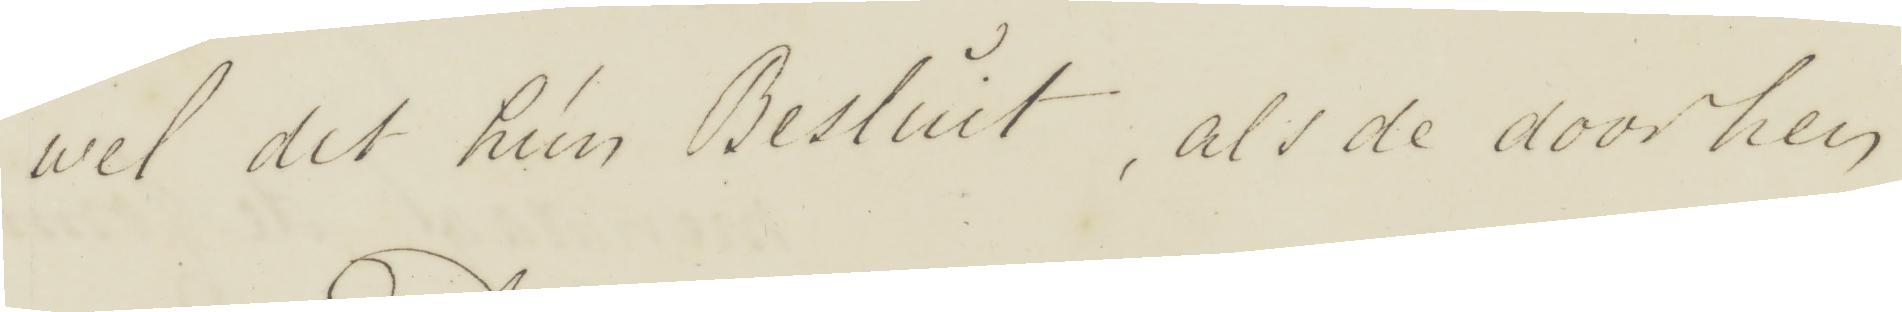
wel dit hun Besluit, als de door hen
